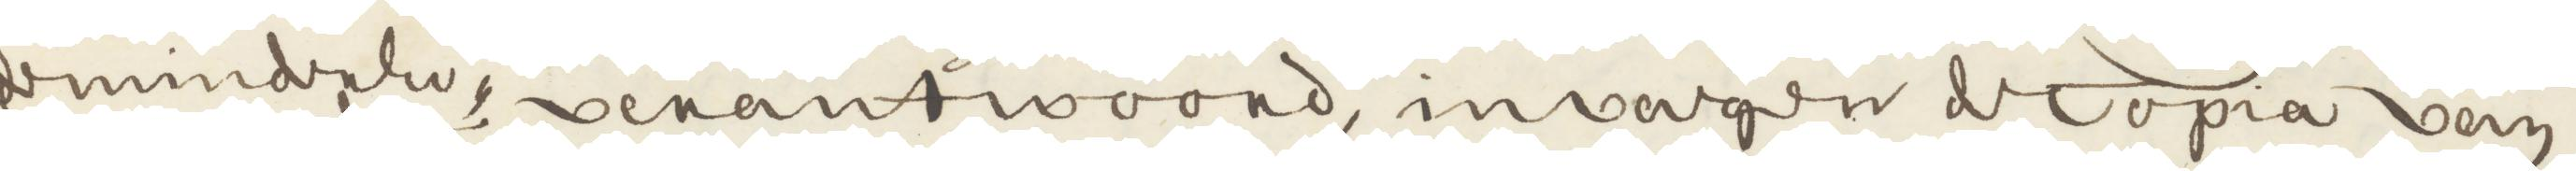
de minderh„ verantwoord, invoegen de Copia van
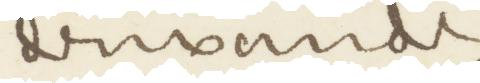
den van de
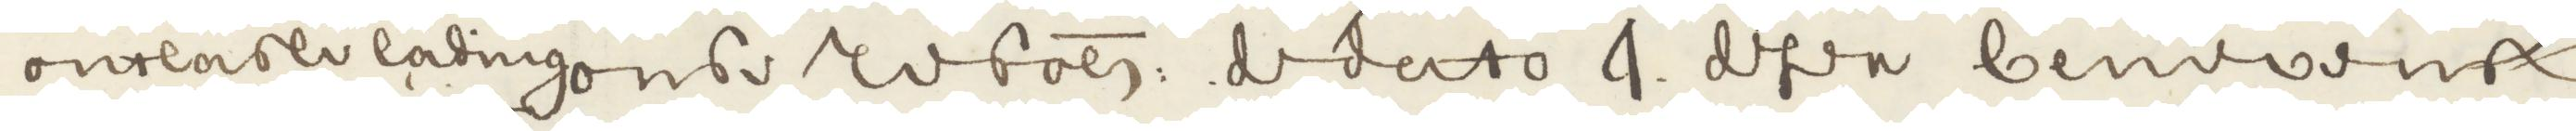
ontlaste lading onse resol: de dato 4. deser benevens
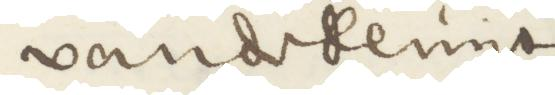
van de fluijt
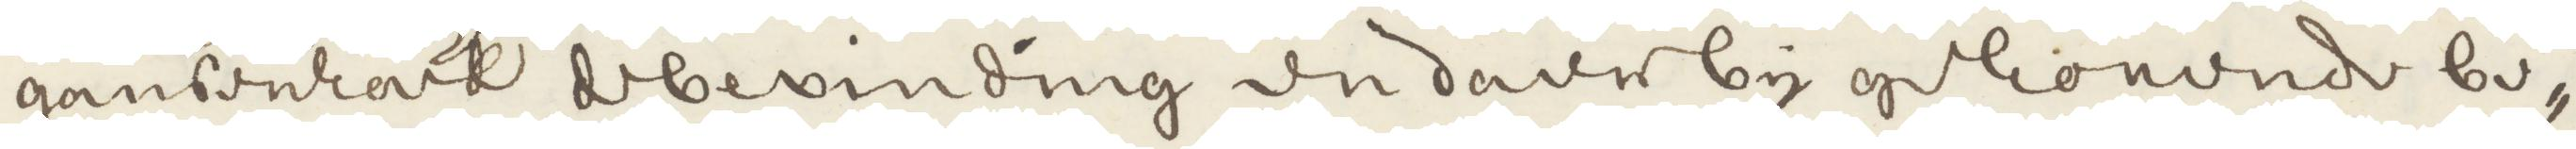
gansenhoef de bevinding en daerbij gehorende be„
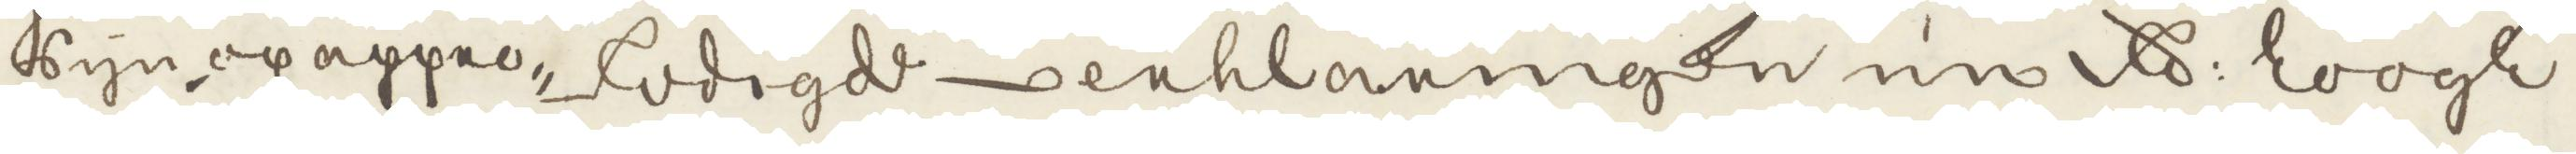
sijn op appro„ Eedigde verklaringen uw Ed: hoogh
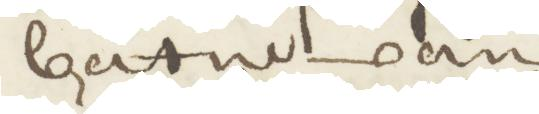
batie van
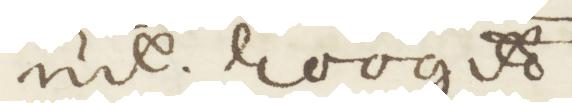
uE. hoog Ed:s
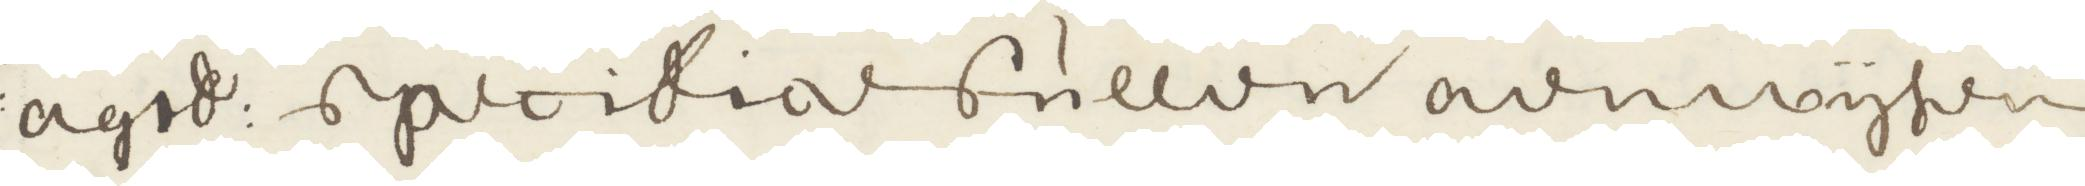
agtb: specific sullen aenwijsen
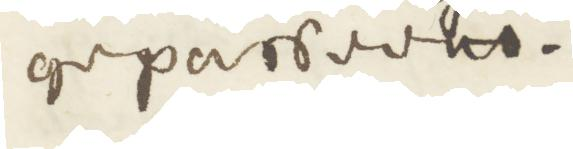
gepasseert.
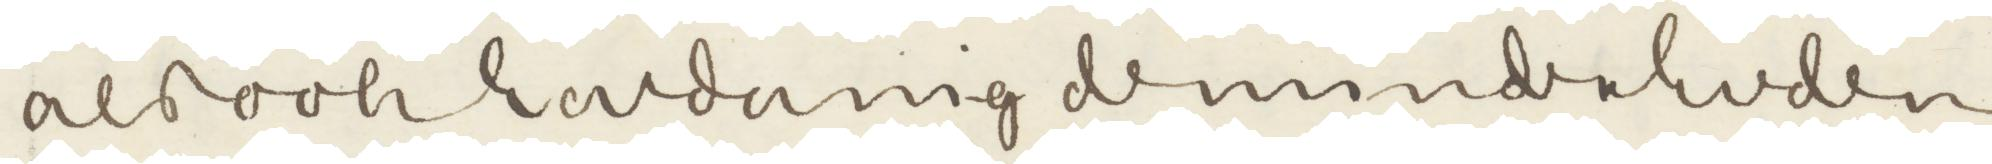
als ook hoedanig de minderheden
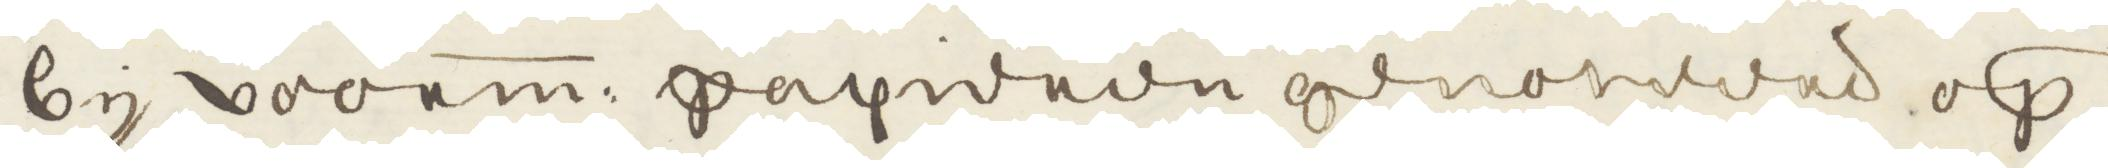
bij voorm: papieren genoteerd op
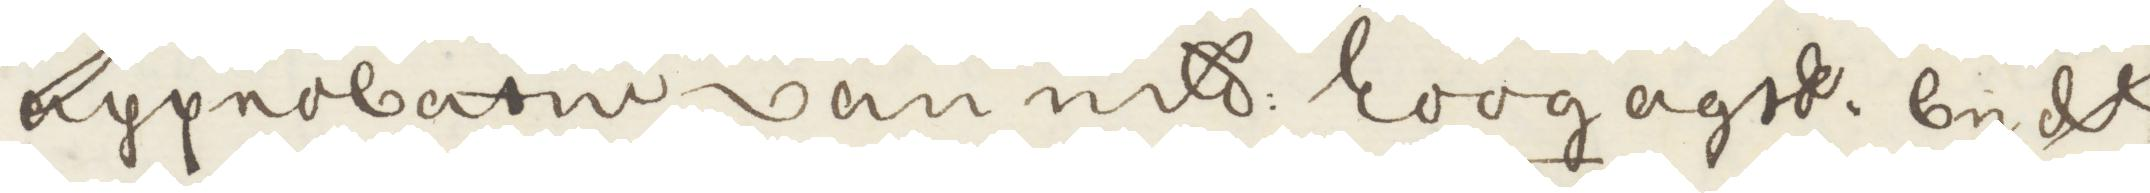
approbatie van u Ed: hoog agtb: bij de
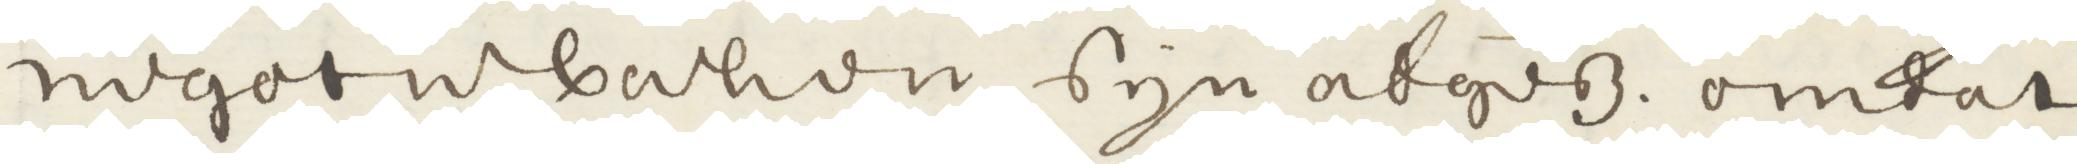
negotieboeken sijn afgesz. omdat
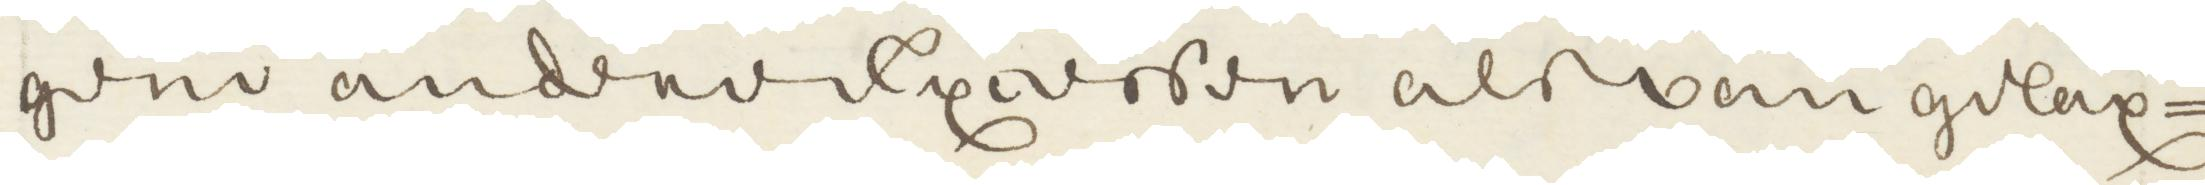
gene andere Excessen als van getax=d
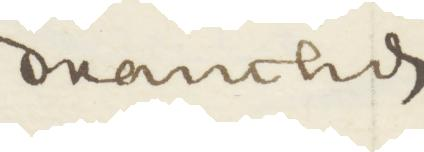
drancken
